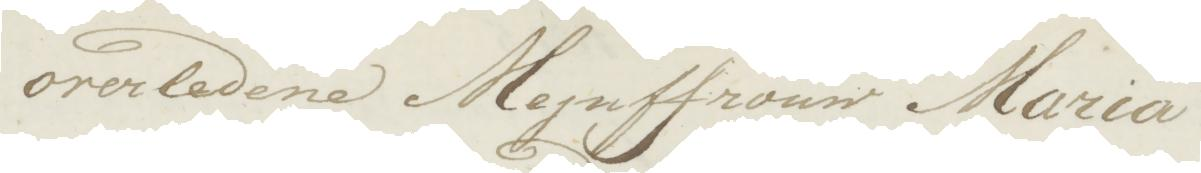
overledene Mejuffrouw Maria
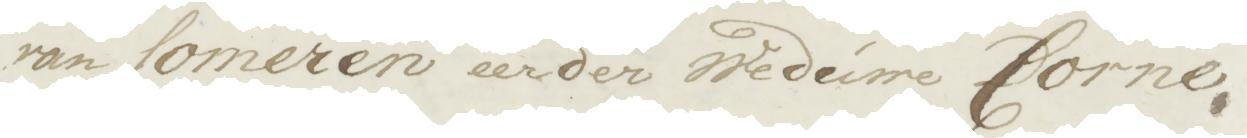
van Someren eerder weduwe Corne„
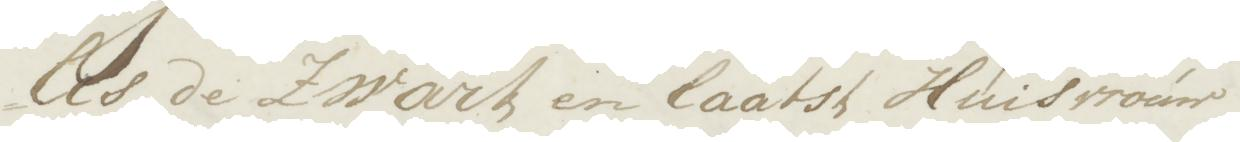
„lis de Zwart en laatst Huisvrouw
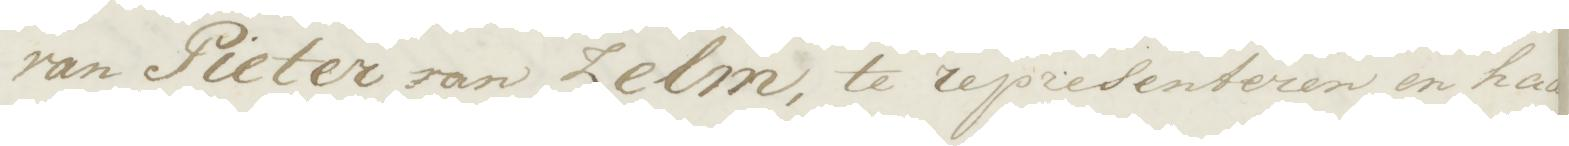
van Pieter van Zelm, te representeren en haa
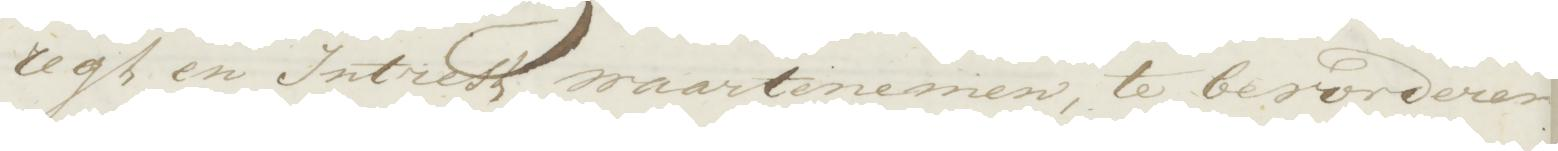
regt en Intrest waartenemen, te bevorderen
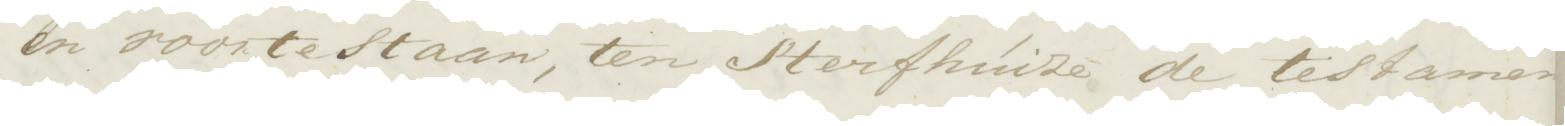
en voor te staan, ten sterfhuize de testamen
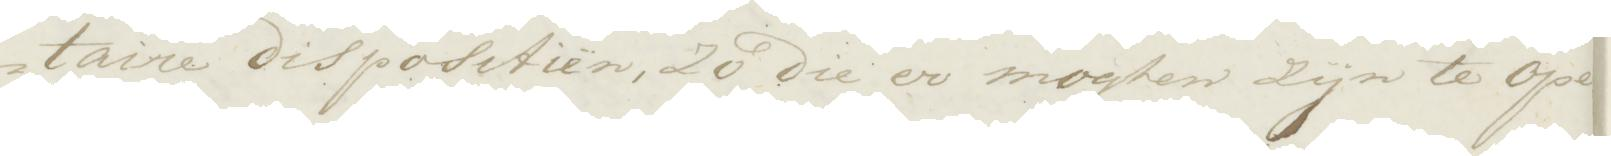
taire dispositiën, zo die er mogten zijn te ope
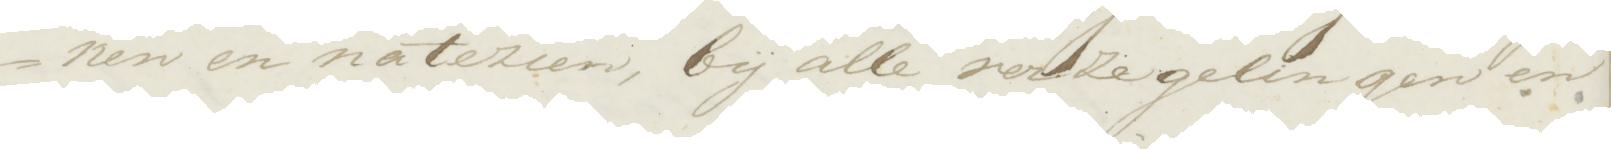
„nen en na tezien, bij alle verzegelin gen en
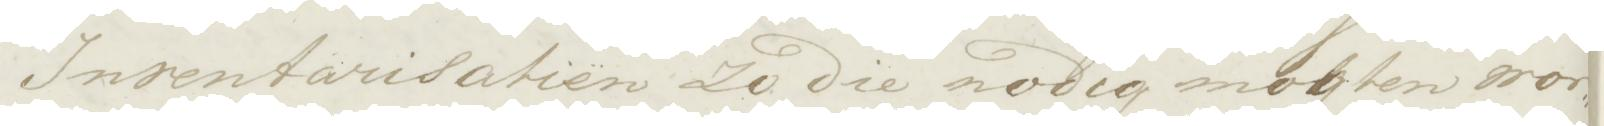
Inventarisatiën zo die nodig mogten wor„
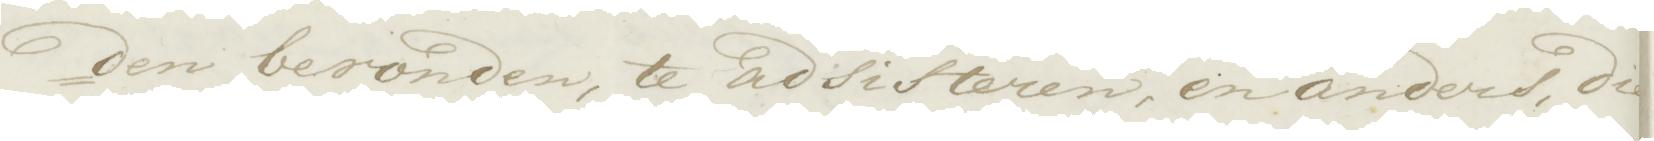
„den bevonden, te adsisteren, en anders, die
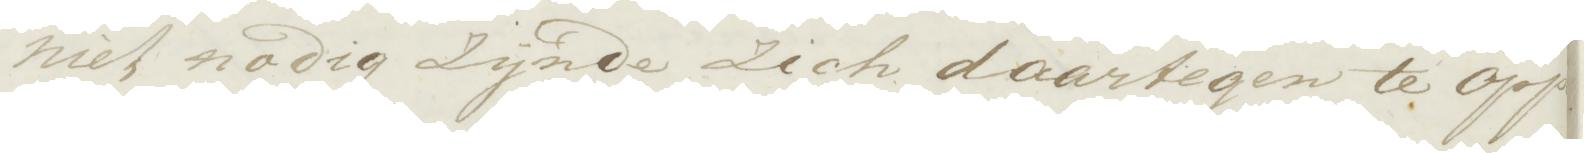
niet nodig zijnde zich daartegen te opp
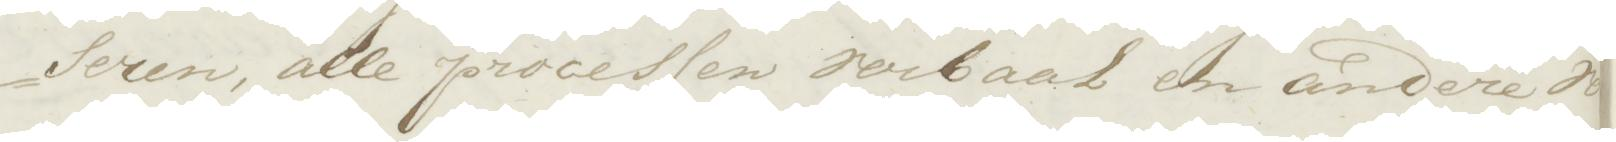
„seren, alle processen verbaal en andere ve
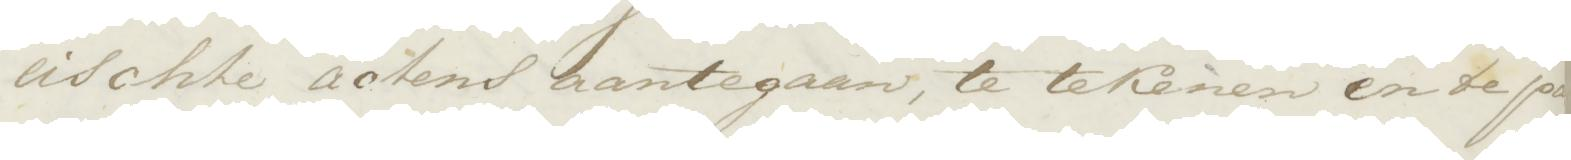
eischte actens aantegaan, te tekenen en te pa
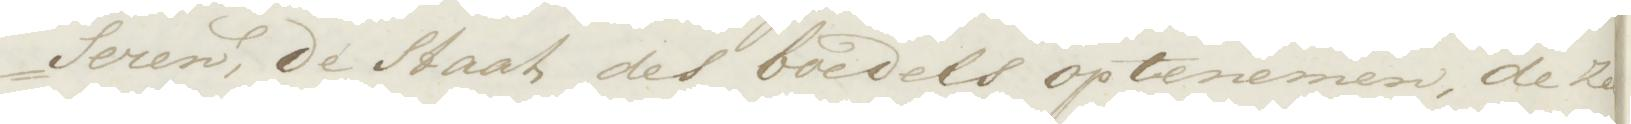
„seren, de staat des boedels op tenemen, de ze
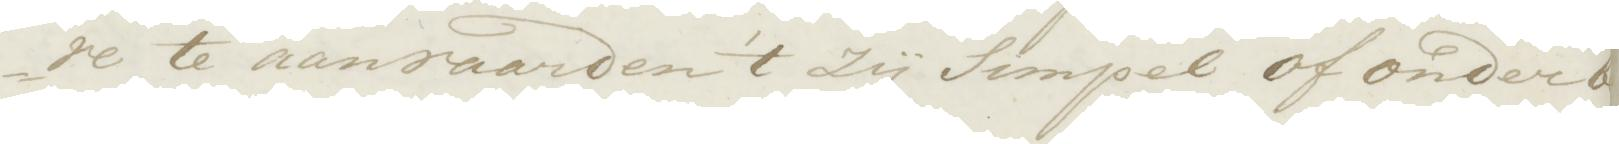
„ve te aanvaarden ’t zij simpel of onder b
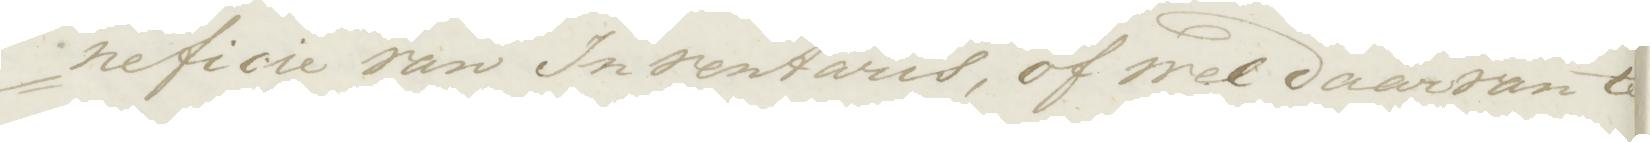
„neficie van Inventaris, of wel daar van te
